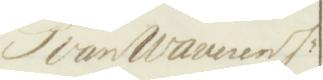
P van WaverenJr
